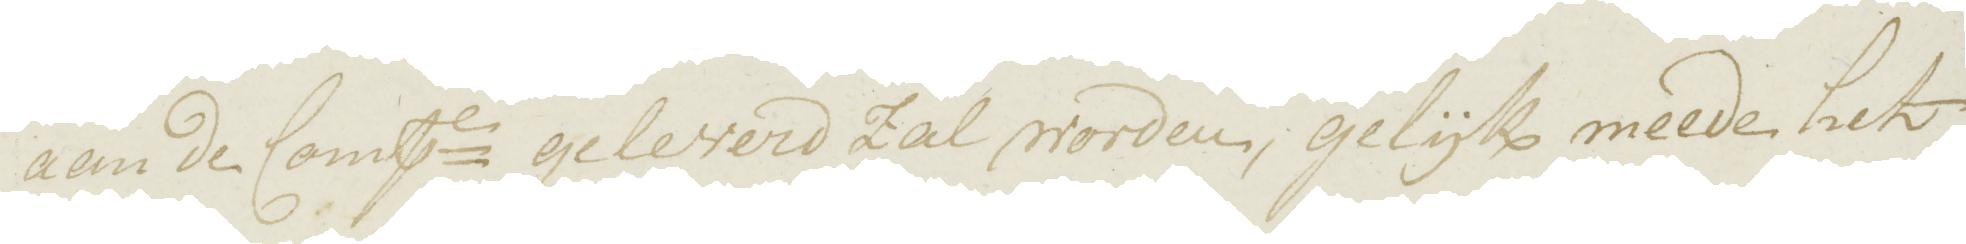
aan de comp=e geleverd zal worden, gelijk meede het
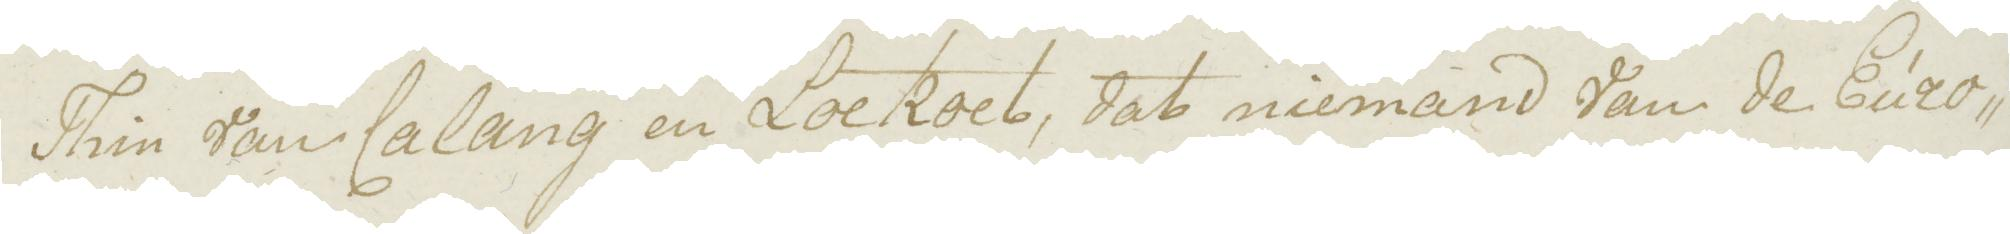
Thin van calang en Loekoet, dat niemand van de Euro„
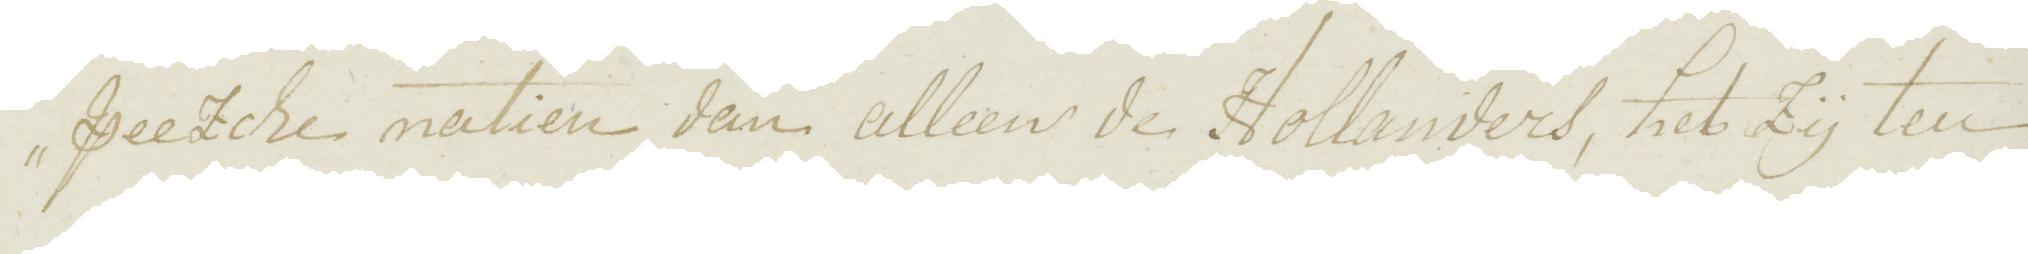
peezche natien dan alleen de Hollanders, het zij ten
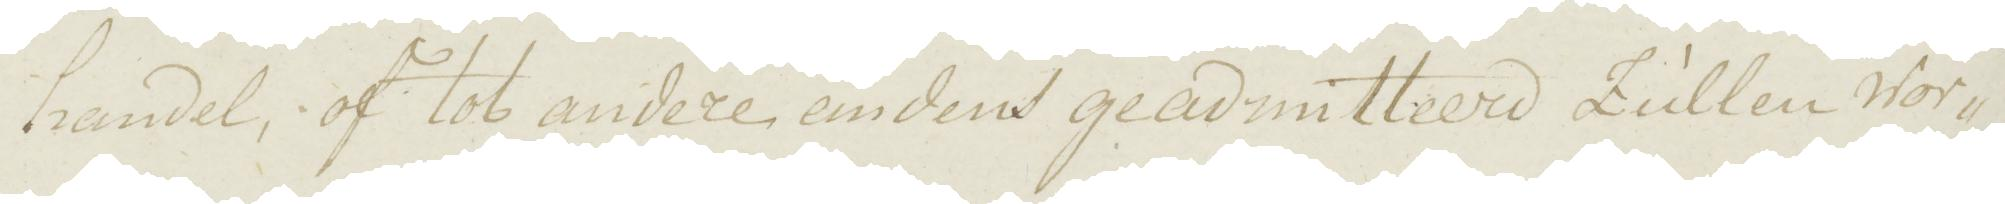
handel, of tot andere eindens geadmitteerd zullen wor„
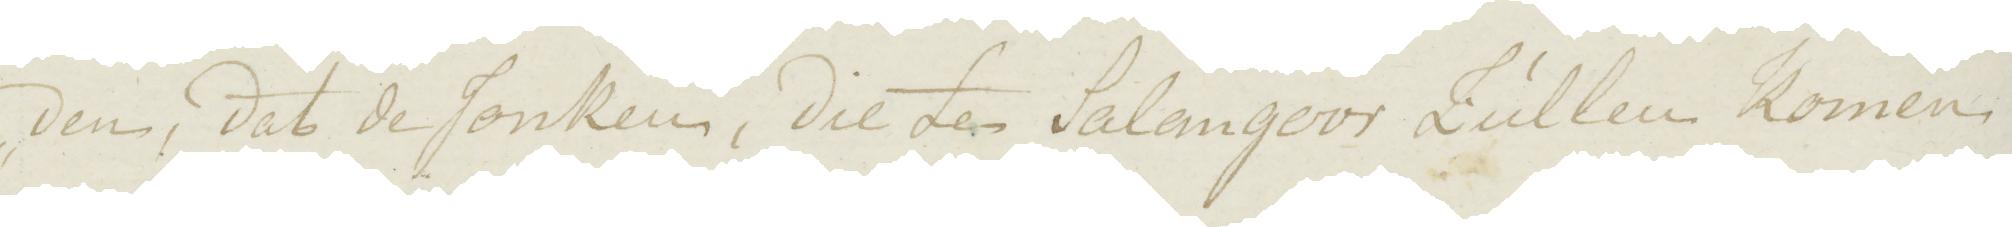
„den, dat de jonken, die te salangoor zullen komen
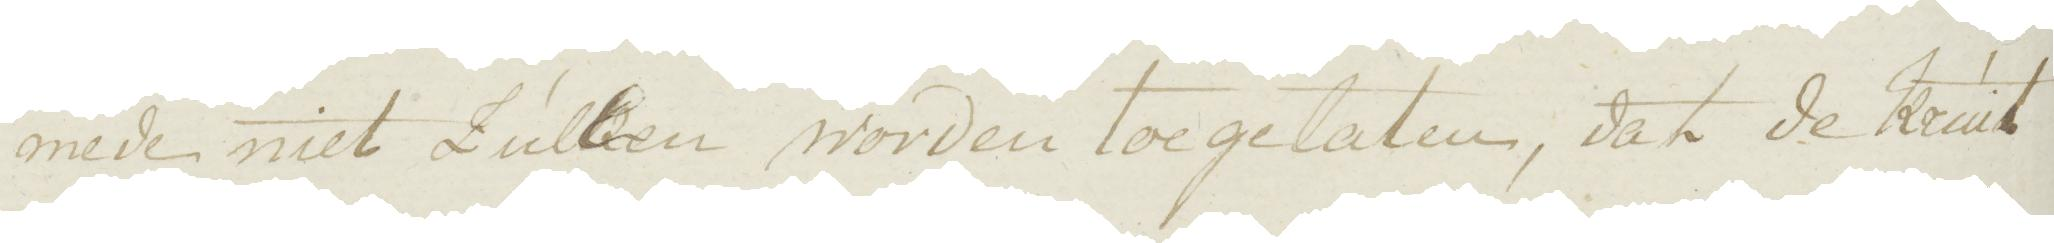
mede niet zullen worden toegelaten, dat de kruit
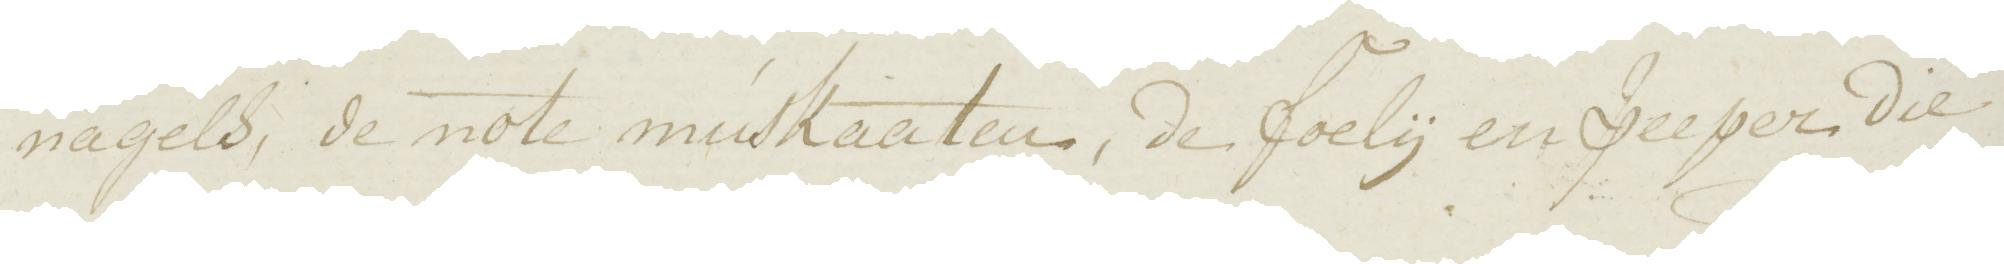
nagels, de note muskaaten, de foelij en Peeper die
